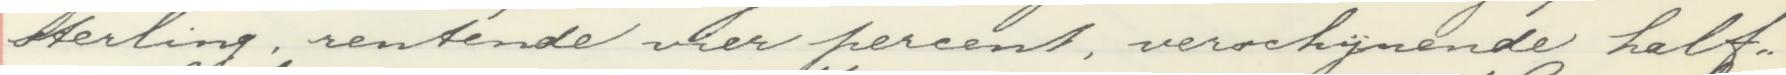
sterling, rentende vier percent, verschijnende half„
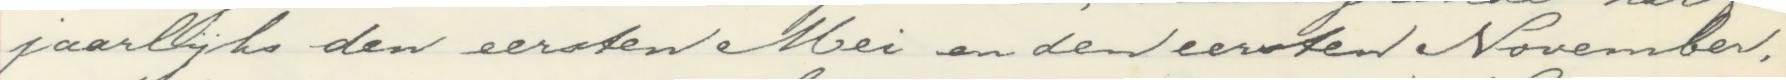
jaarlijks den eersten Mei en den eersten November,
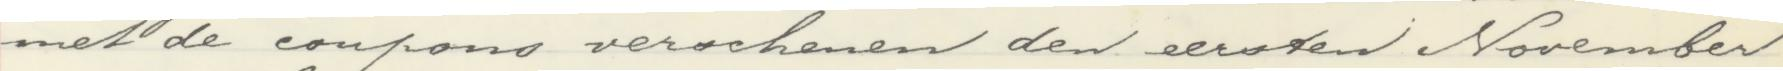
met de coupons verschenen den eersten November
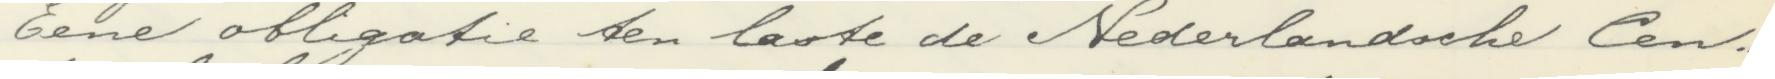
Eene obligatie ten laste de Nederlandsche Cen„
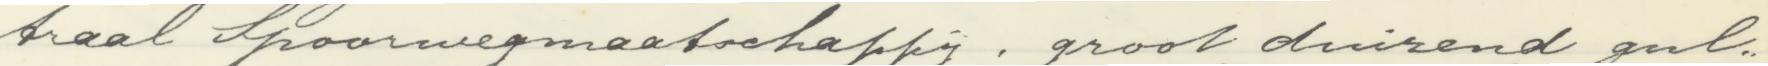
traal Spoorwegmaatschappij, groot duizend gul„
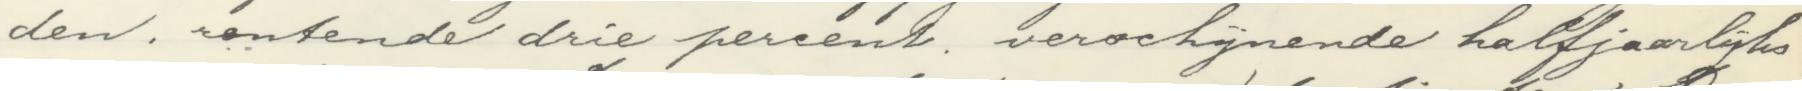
den, rentende drie percent, verschijnende halfjaarlijks
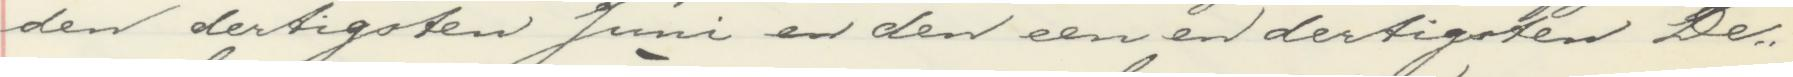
den dertigsten Juni en den een en dertigsten De„
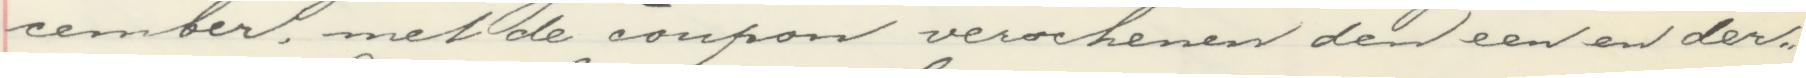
cember, met de coupon verschenen den een en der„
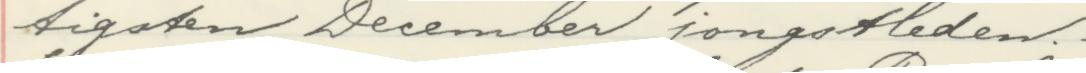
tigsten December jongstleden.
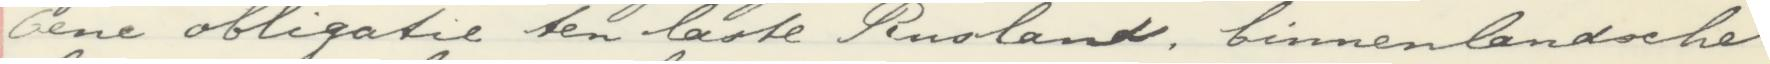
Eene obligatie ten laste Rusland, binnenlandsche
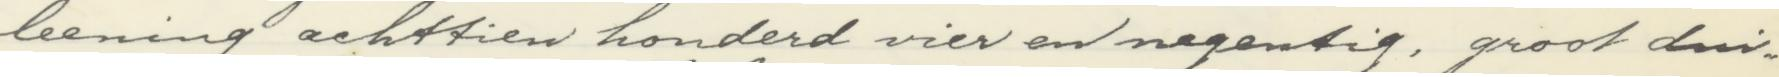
leening achttien honderd vier en negentig, groot dui„
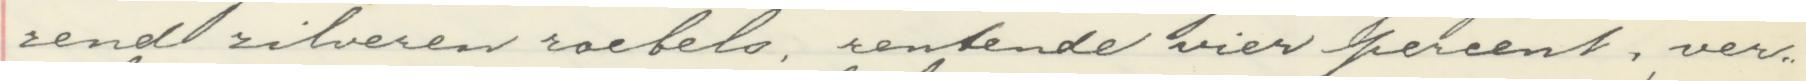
zend zilveren roebels, rentende vier percent, ver„
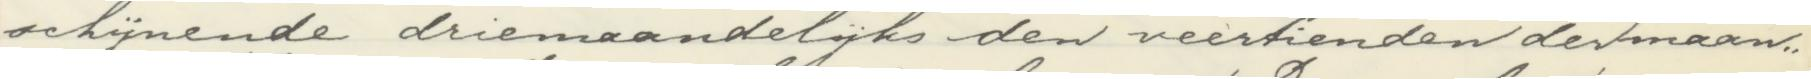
schijnende driemaandelijks den veertienden der maan„
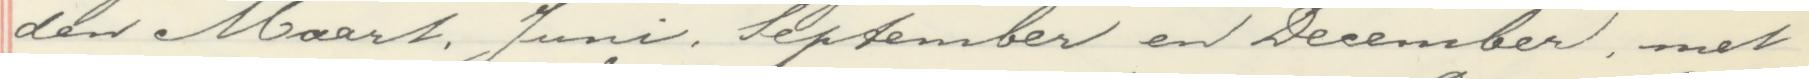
den Maart, Juni, September en December, met
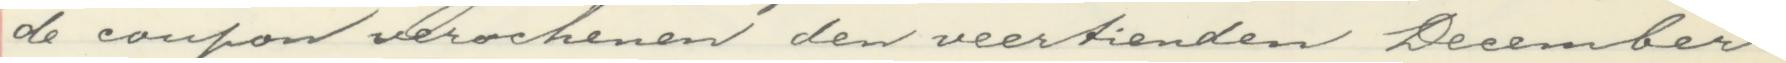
de coupon verschenen den veertienden December
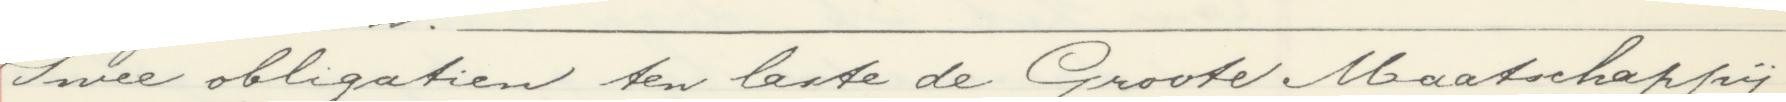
Twee obligatien ten laste de Groote Maatschappij
